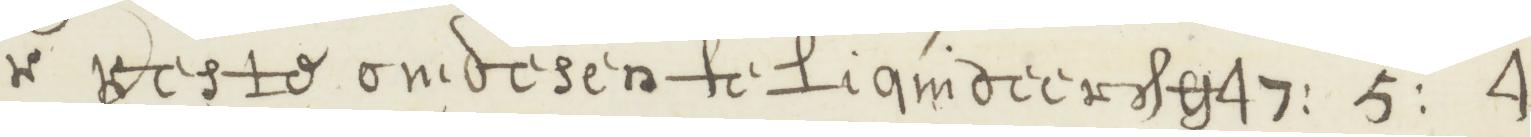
De Weste om desen te Liquideeren g 947: 5: 4
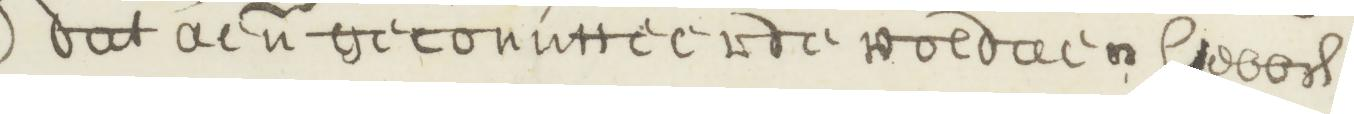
dat aen geconutteerde voldaen hebben
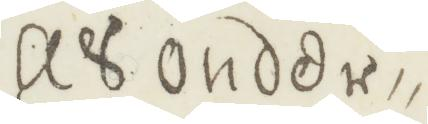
Was onder„
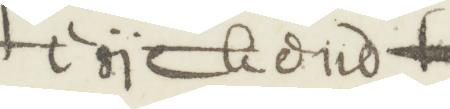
teijckendt
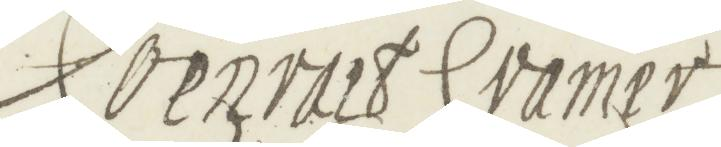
Coenraed Cramer
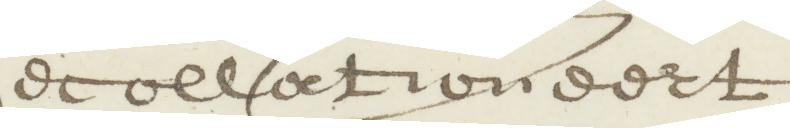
Gecollationeert
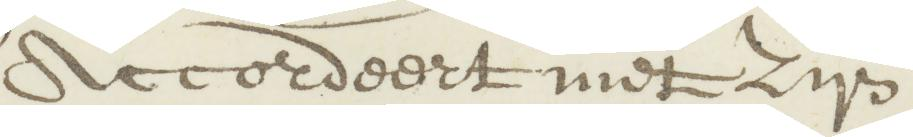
Accordeert met zijn
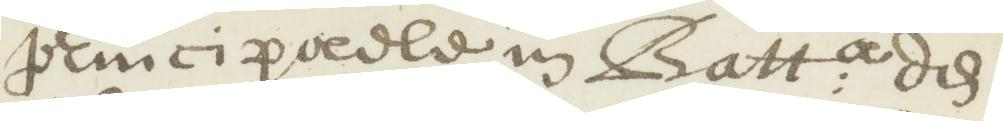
principaele in Batt:a den
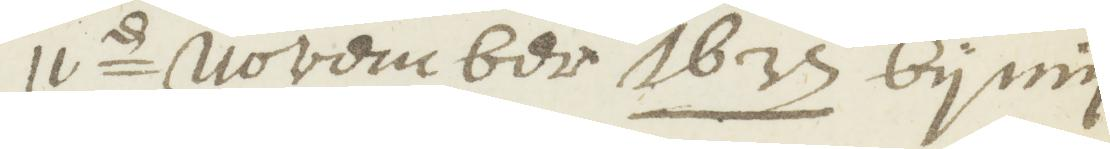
11=e november 1635 bij mij
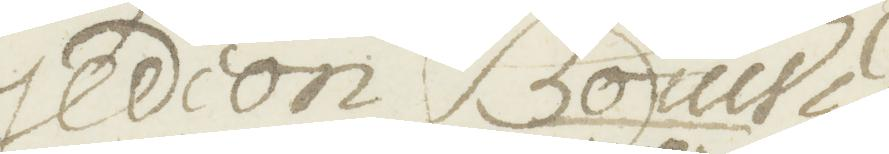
Gedeon Boutters
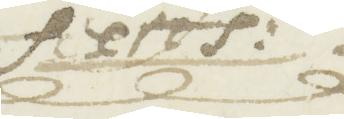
Secrts
